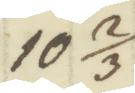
2. 10 2/3
